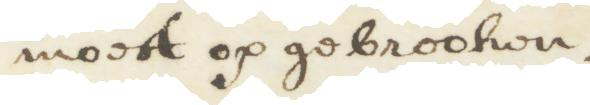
moest op gebrooken
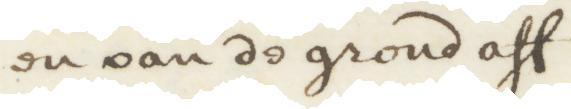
en van de grond aff
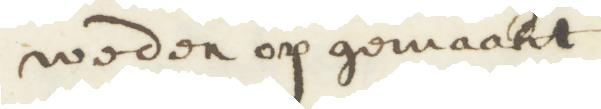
weder op gemaakt
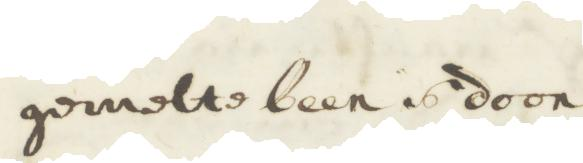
gemelte beer is door
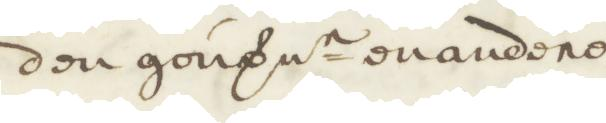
den gouvern=r en andere
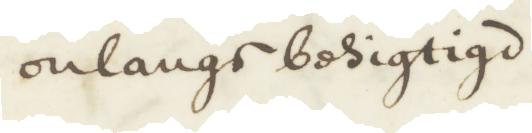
onlangs besigtigd
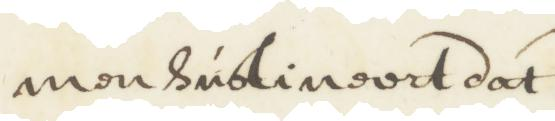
men sustineert dat
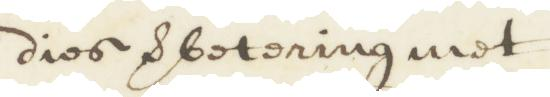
dies verbetering met
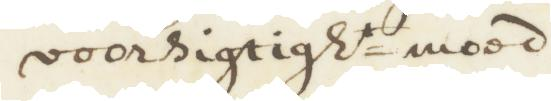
voorsigtigh=t moed
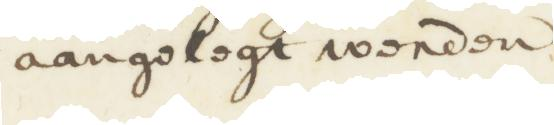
aangelegt werden
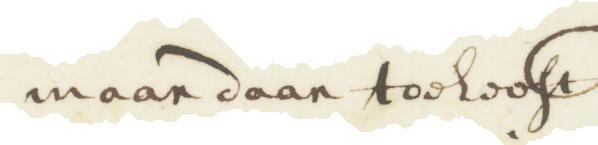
maar daar toe heeft
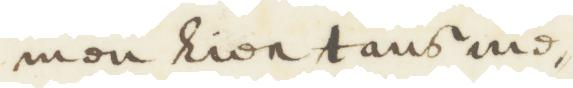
men hier tans nie„
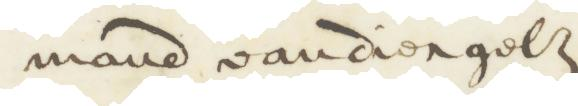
mand van diergelijk
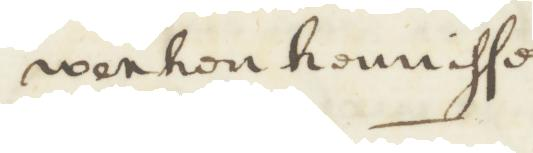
werken kennisse
